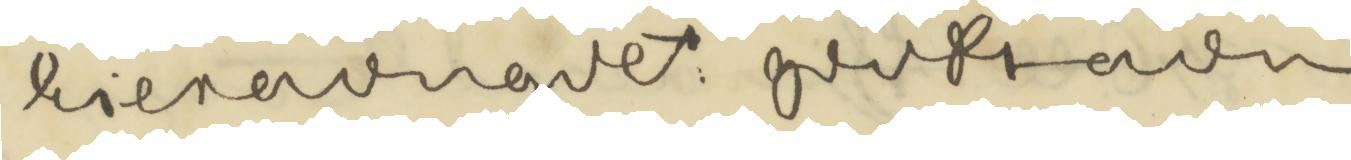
hieraen gel:t geeft aen
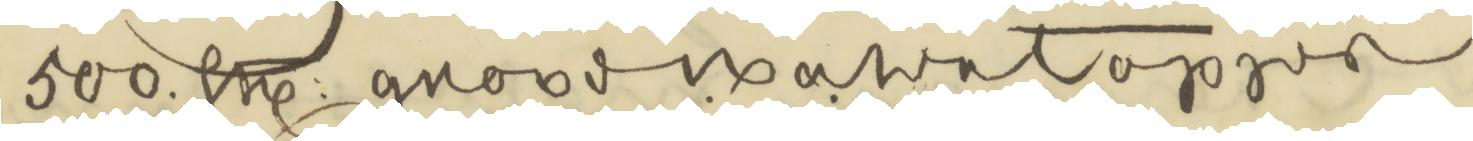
500. stx: grove water Copjes
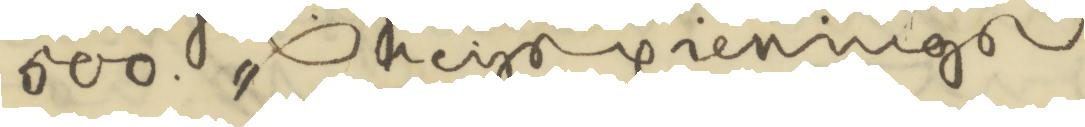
500. „ reijspierings
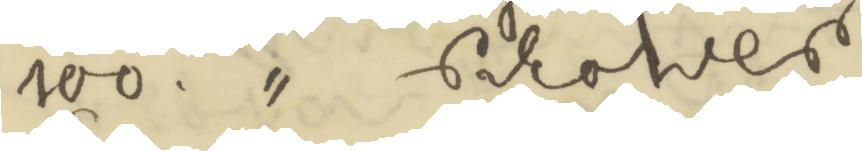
100. „ schotels
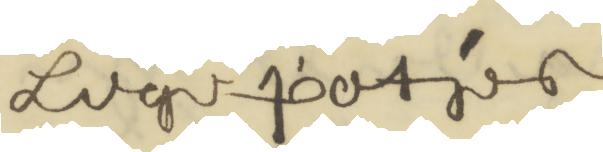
60. „ lege potjes
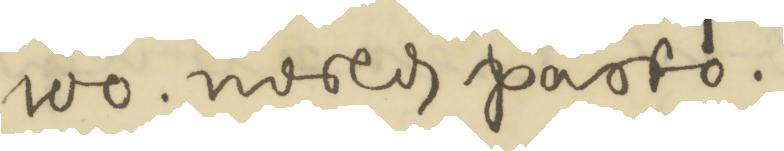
100. nesten passo.
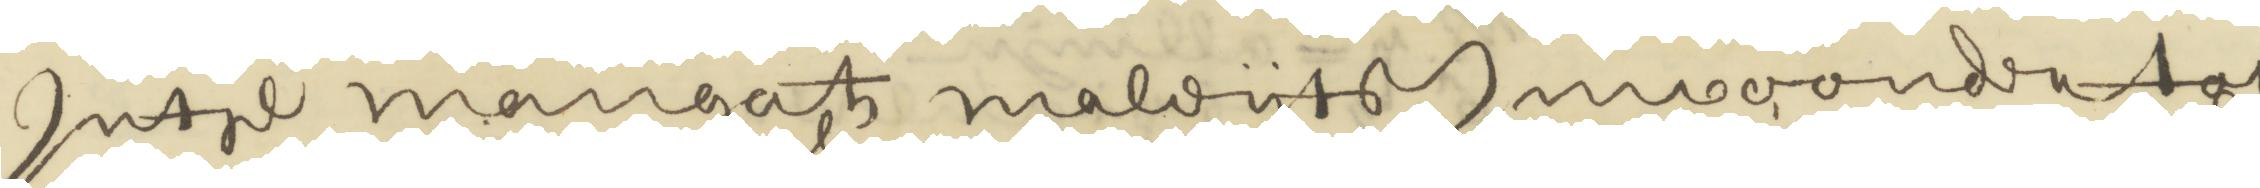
jntje mangast maleijts jnwoonder tot
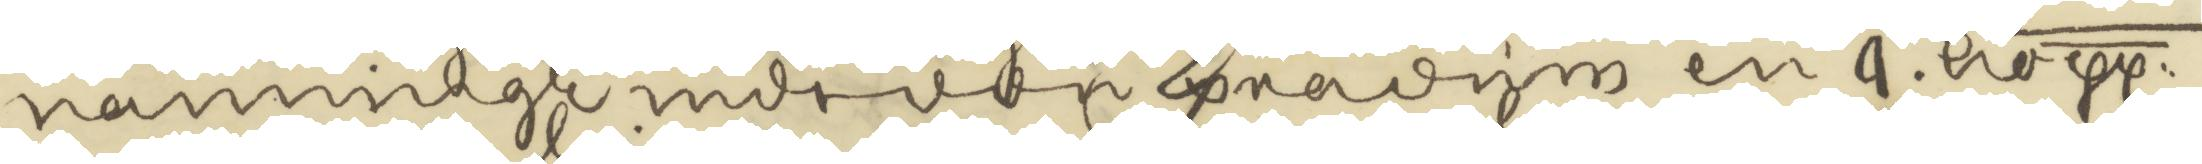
nanningh met een praeuw en 4. kopp:
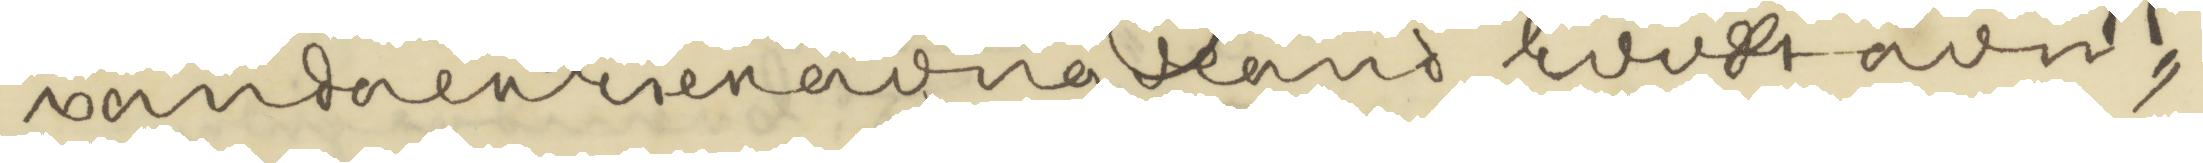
van daer hier aengeland heeft aen„
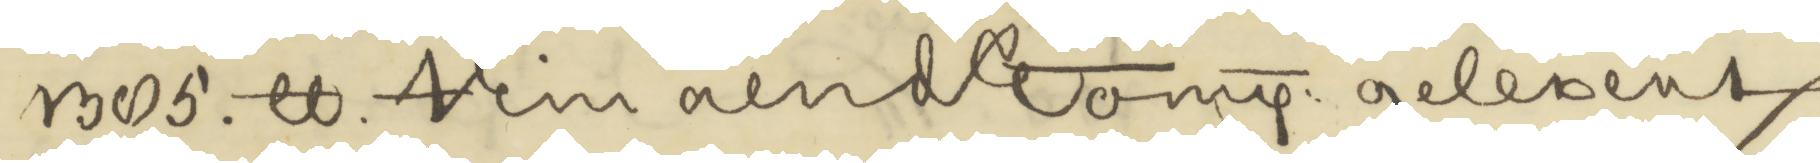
1385. lb. thin aen de Comp: gelevert
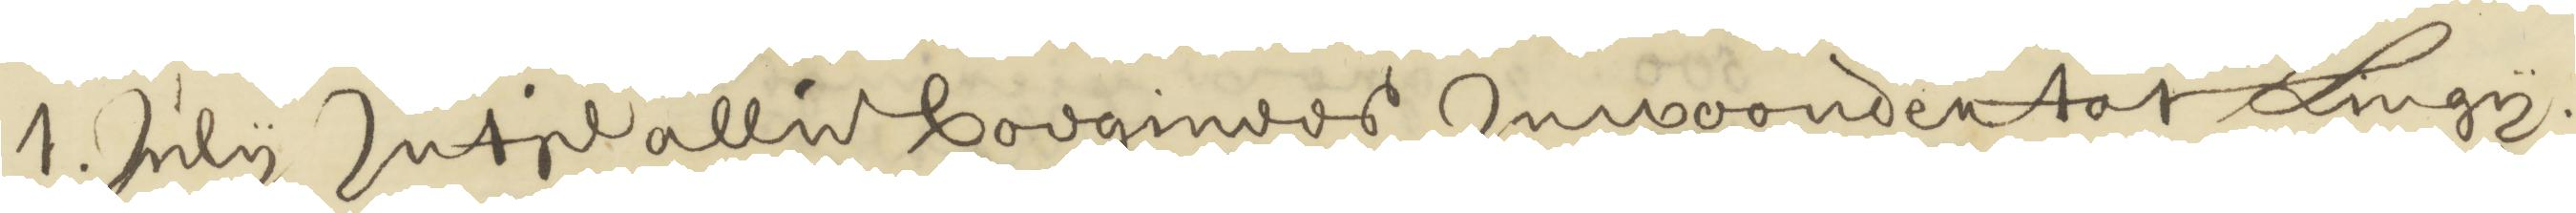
1. julij jntje allie boeginees jnwoonder tot lingij.
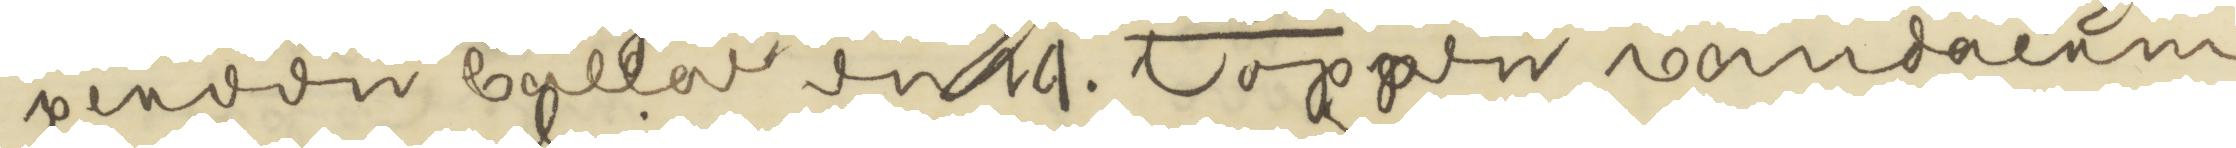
per een balloe en 14. Coppen van daer in
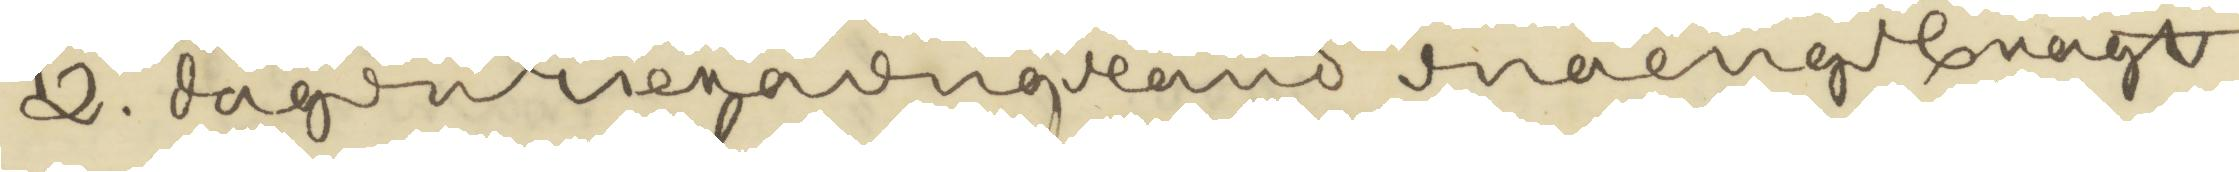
2. dagen hier aengeland en aengebragt
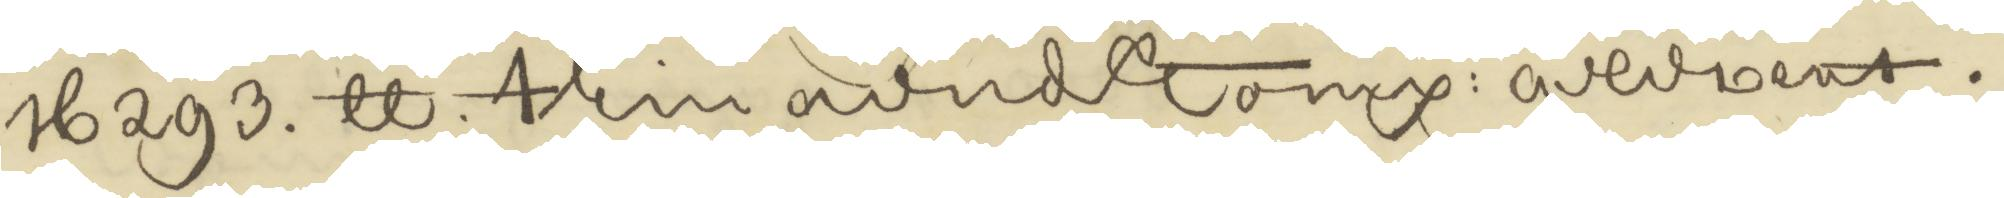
16293. lb. thin aen dE Comp: gelevert.
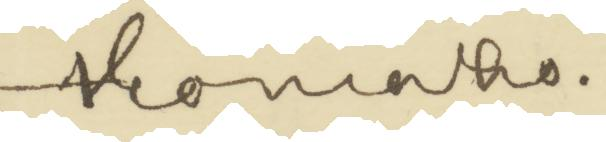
thomaeko.
